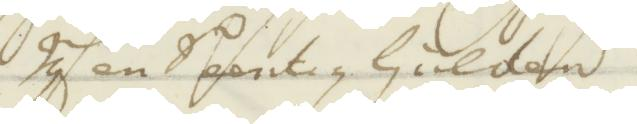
Vyf en Veertig Gulden
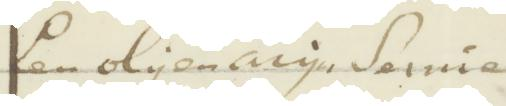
Een olij en azijn servies
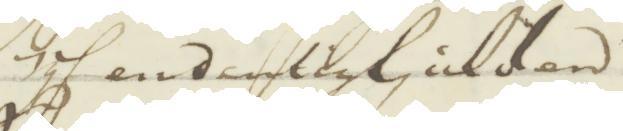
vyf en dertig Gulden
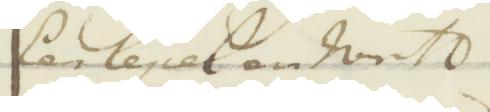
Een lepel en vork
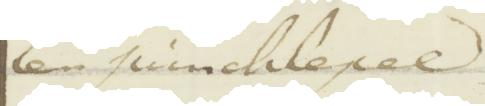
Een punchlepel
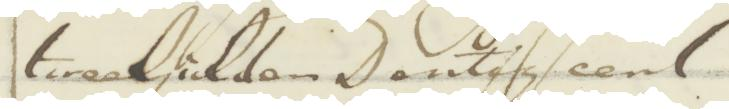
twee Gulden Dertig cent.
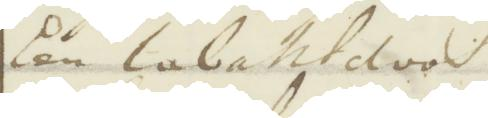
Een tabaksdoos
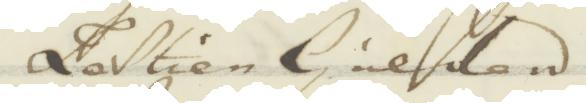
Zestien Gulden
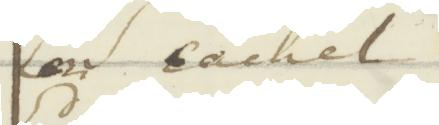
Een cachet
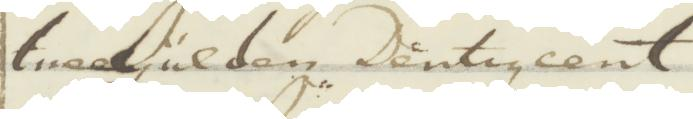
twee Gulden Dertig cent
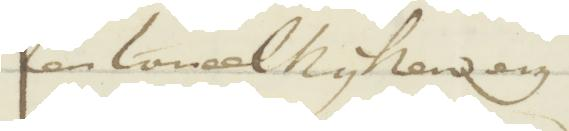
Een toneelkyker enz
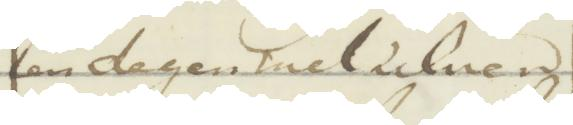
Een degen met zilver
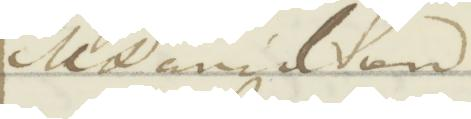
M Danielsen
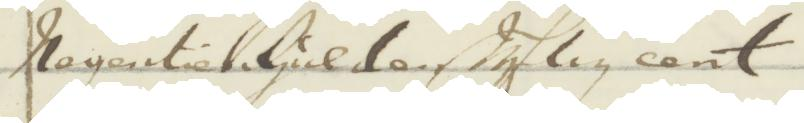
Negentien Gulden vyftig cent
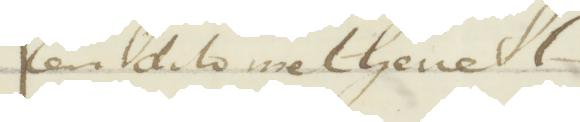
Een dito met Gevest
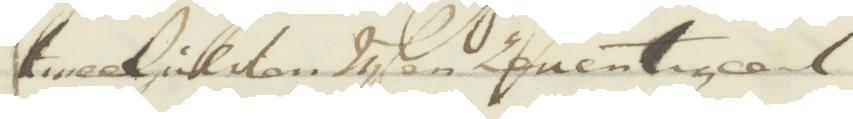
twee Gulden Vijf en zeventig cent
